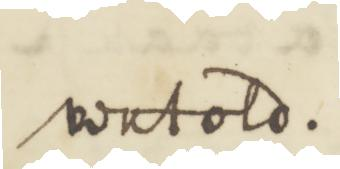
vertold.
